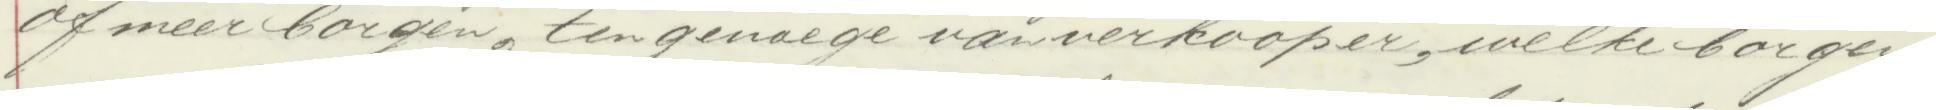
of meer borgen, ten genoege van verkooper, welke borgen
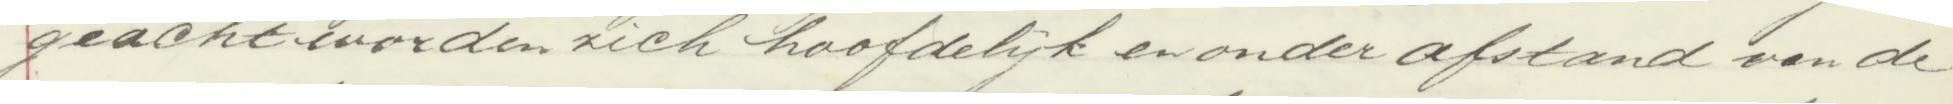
geacht worden zich hoofdelijk en onder afstand van de
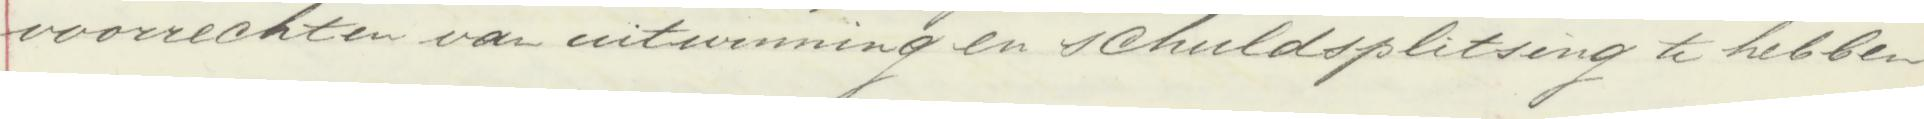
voorrechten van uitwinning en schuldsplitsing te hebben
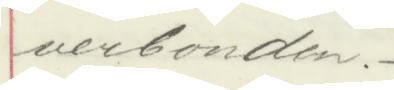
verbonden.
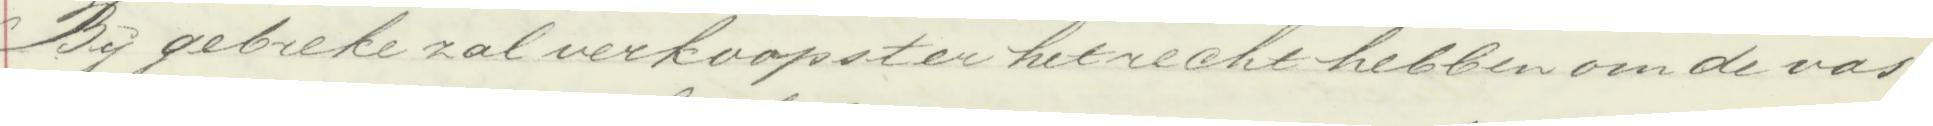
Bij gebreke zal verkoopster het recht hebben om de vas-
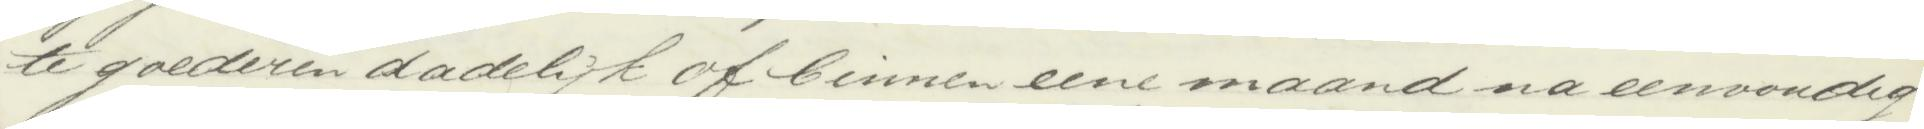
te goederen dadelijk of binnen eene maand na eenvoudig
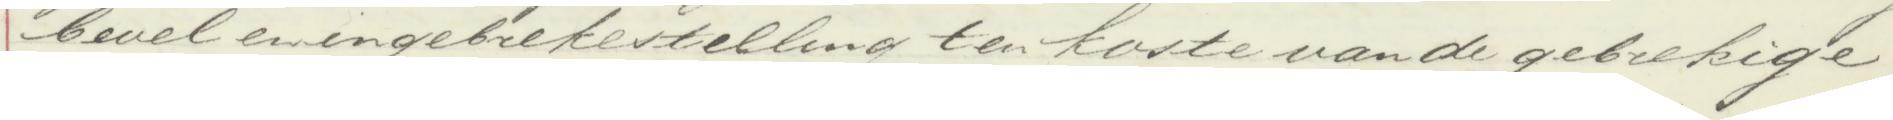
bevel en ingebrekestelling ten koste van de gebrekige
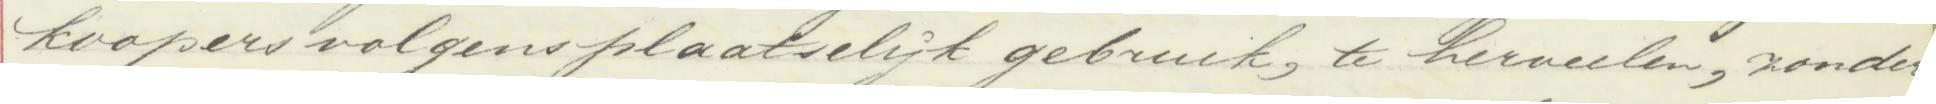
koopers volgens plaatselijk gebruik, te herveilen, zonder
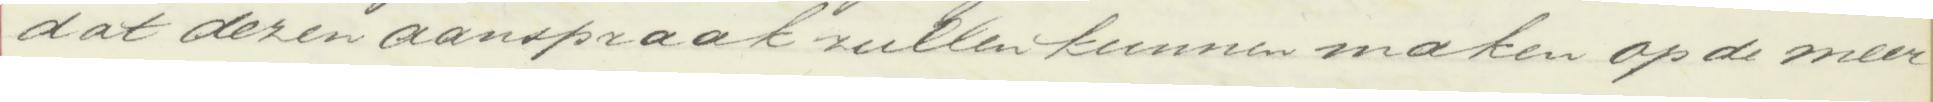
dat dezen aanspraak zullen kunnen maken op de meer
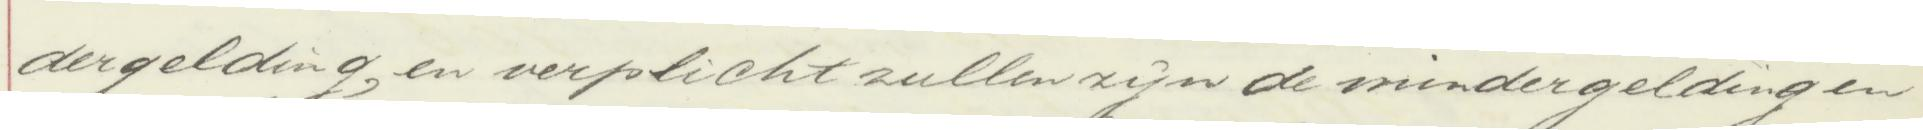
dergelding, en verplicht zullen zijn de mindergelding en
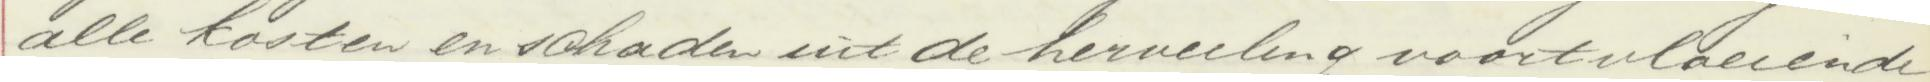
alle kosten en schaden uit de herveiling voortvloeiende
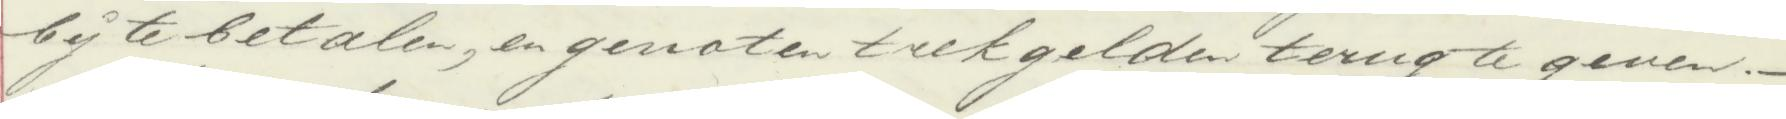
bij te betalen, en genoten trekgelden terug te geven.
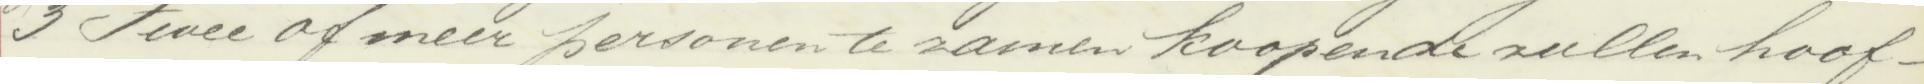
3 Twee of meer personen te zamen koopende zullen hoof-
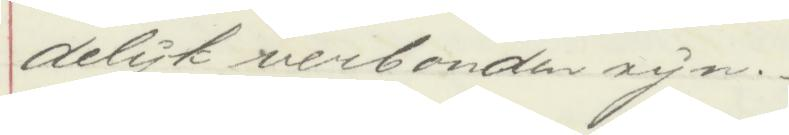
delijk verbonden zijn.
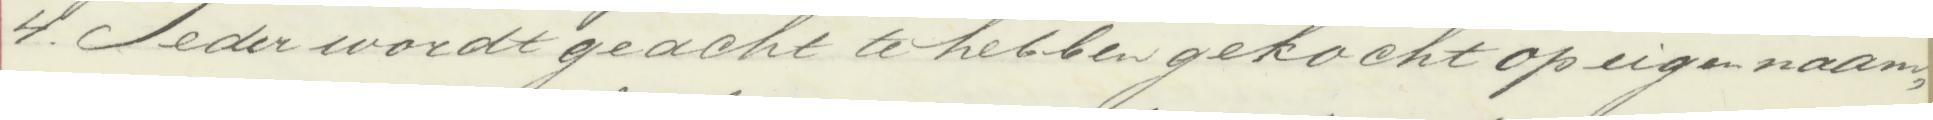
4. Ieder wordt geacht te hebben gekocht op eigen naam,
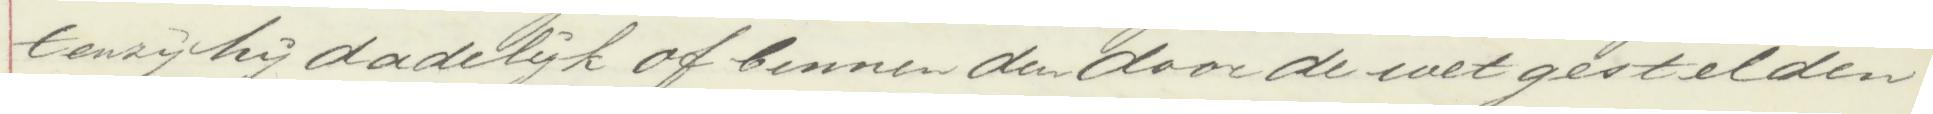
tenzij hij dadelijk of binnen den door de wet gestelden
